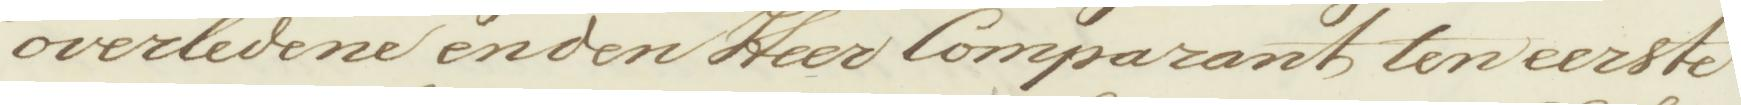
overledene en den Heer Comparant ten eerste
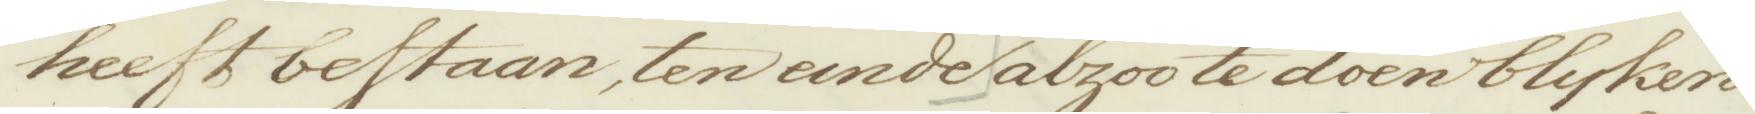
heeft bestaan, ten einde, alzoo te doen blyken
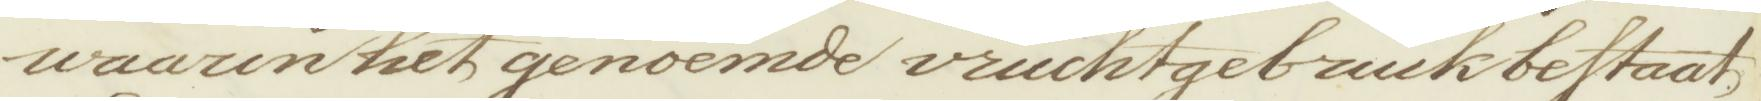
waarin het genoemde vruchtgebruik bestaat.
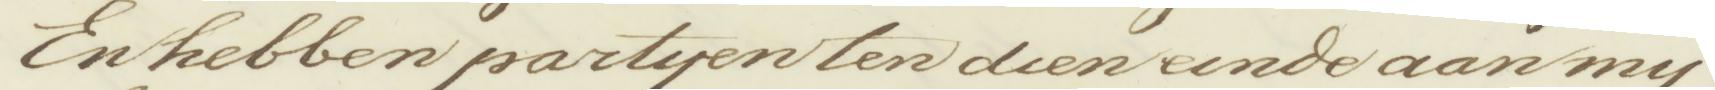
En hebben partyen ten dien einde aan my
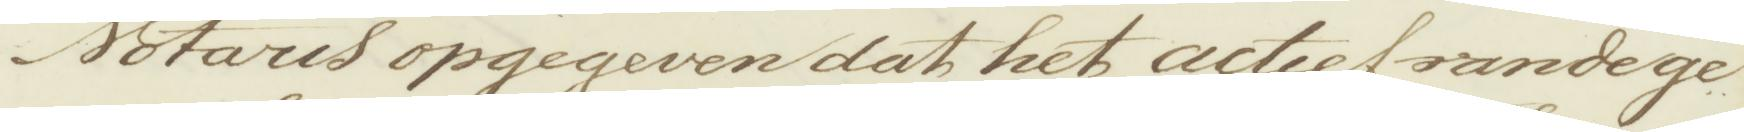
Notaris opgegeven dat het actief van de ge„
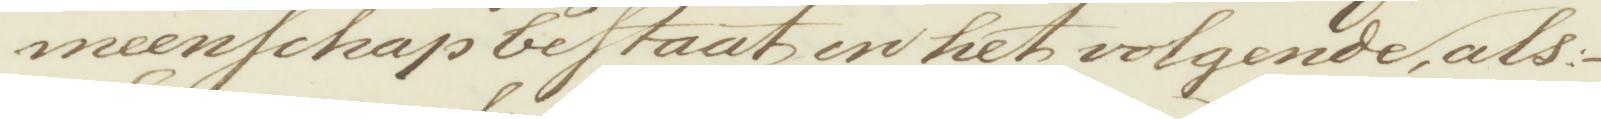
meenschap bestaat in het volgende, als:
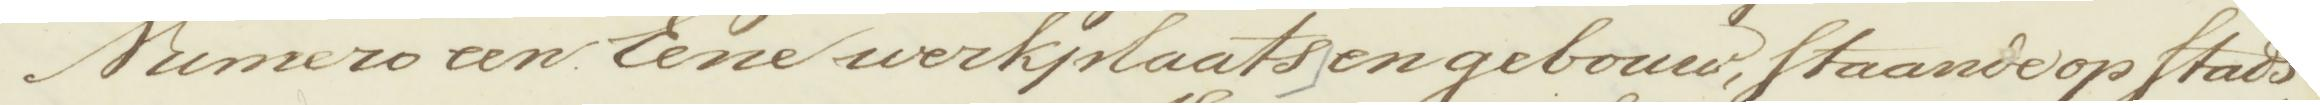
Numero een Eene werkplaats, en gebouw, staande op stads
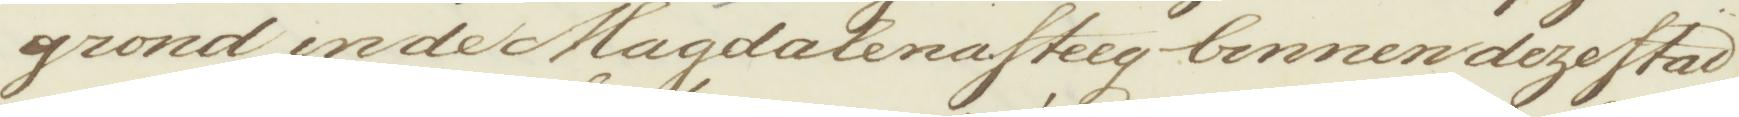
grond in de Magdalenasteeg binnen deze stad,
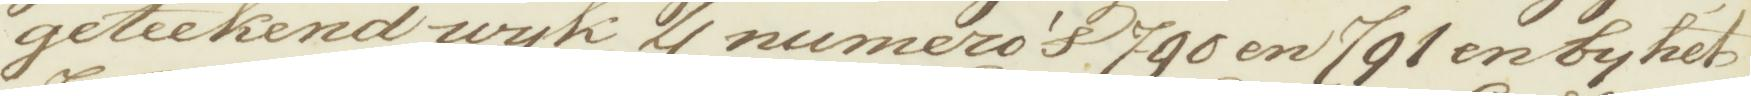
geteekend wyk 4 numero's 790 en 791 en by het
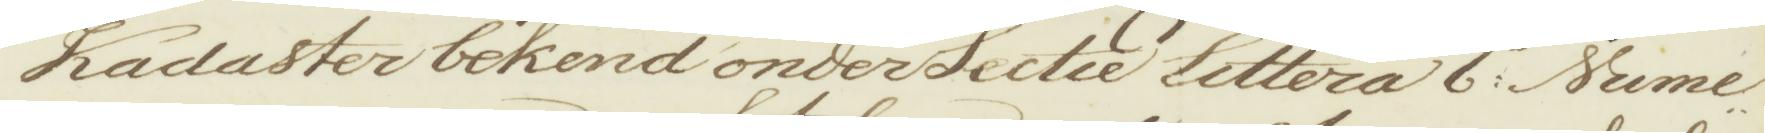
Kadaster bekend onder sectie Littera C: Nume
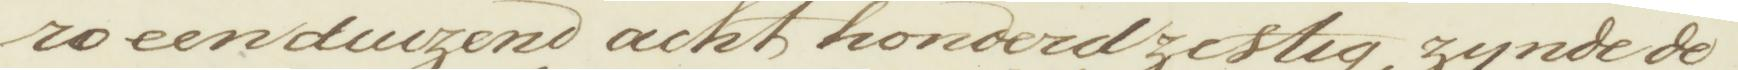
ro een duizend acht honderd zestig, zynde de
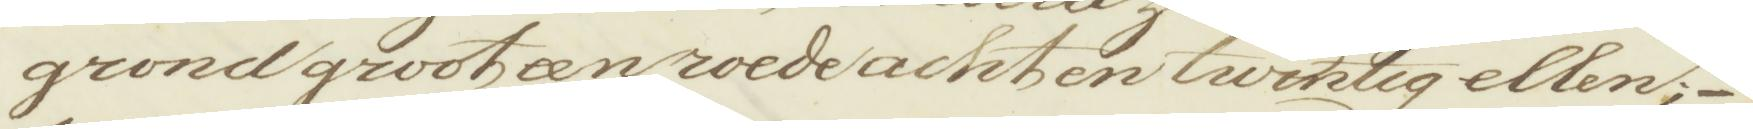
grond groot een roede acht en twintig ellen; —
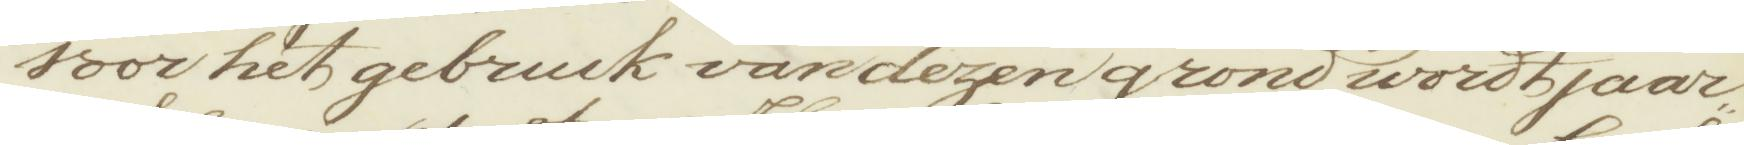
voor het gebruik van dezen grond wordt jaar
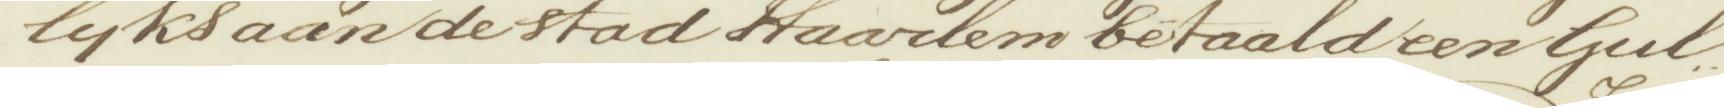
lyks aan de stad Haarlem betaald een Gul„
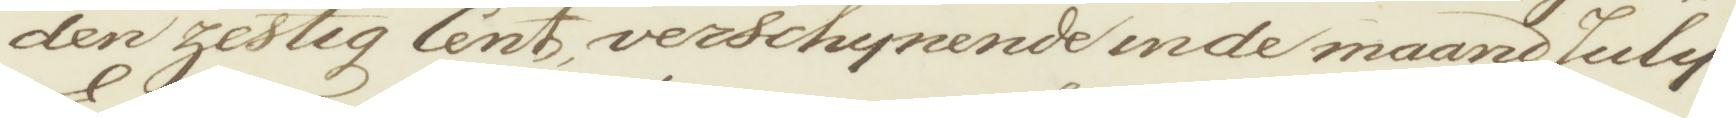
den zestig Cent, verschynende inde maand July.
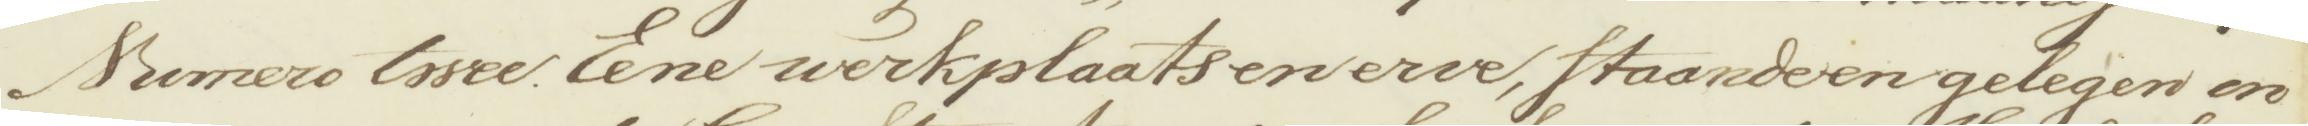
Numero twee Eene werkplaats en erve, staande en gelegen in
